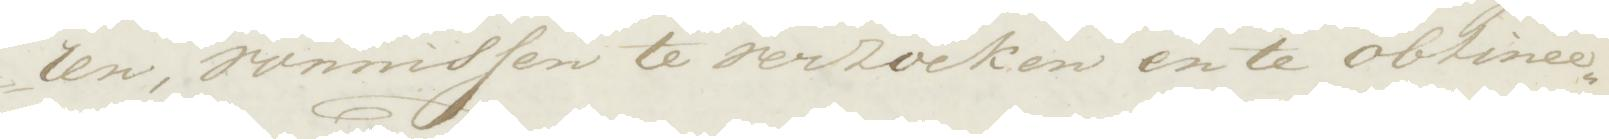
„ren, vonnissen te verzoeken en te obtinee„
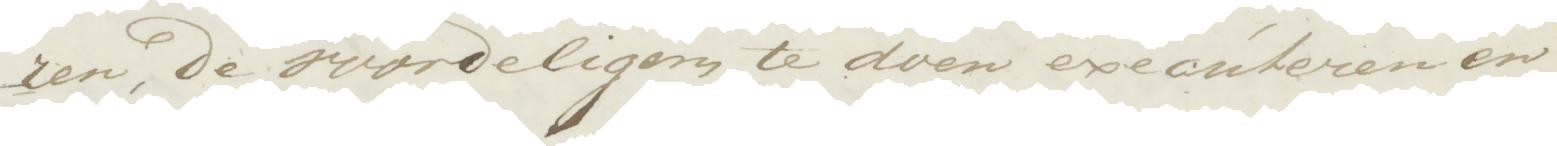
ren, de voordeligen te doen executeren en
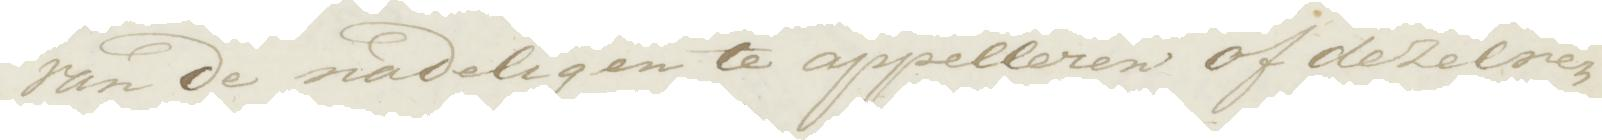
van de nadeligen te appelleren of dezelven
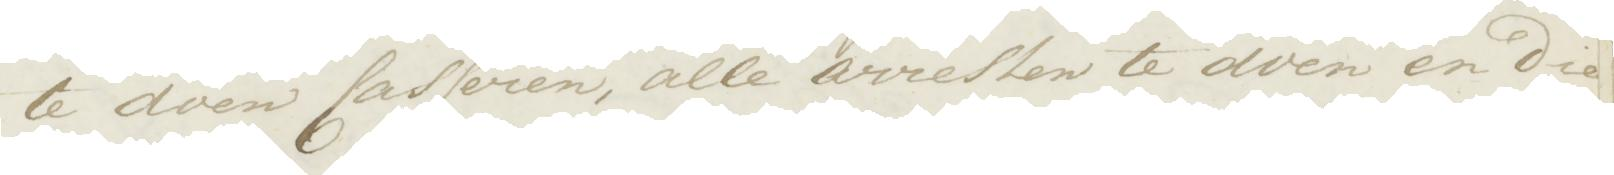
te doen Casseren, alle arresten te doen en die
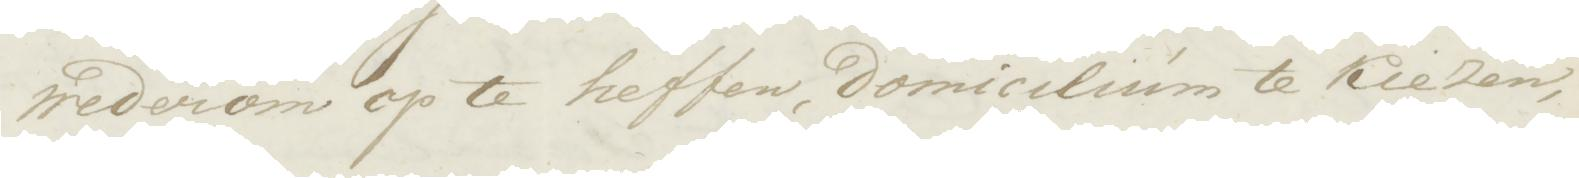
wederom op te heffen, domicilium te kiezen,
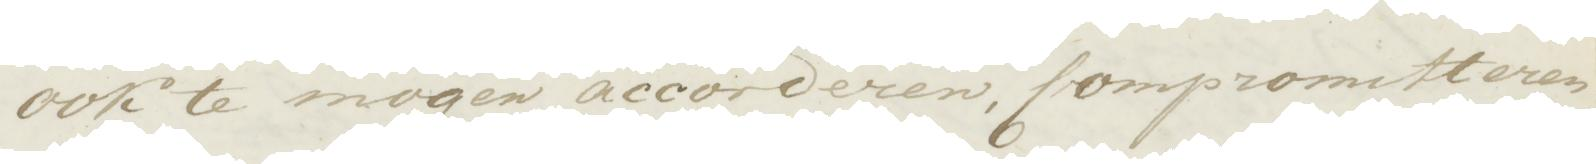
ook te mogen accorderen, Compromitteren
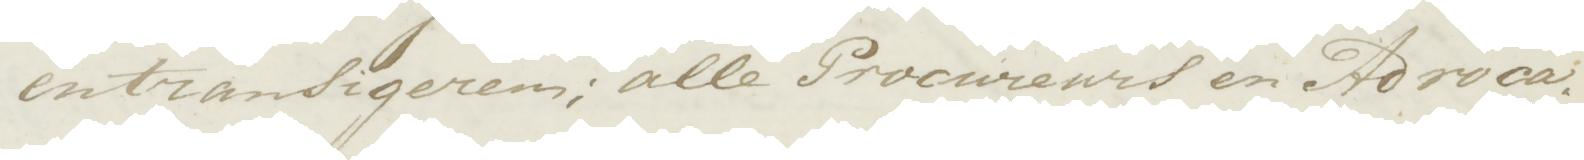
en transigeren: alle Procureurs en Advoca„
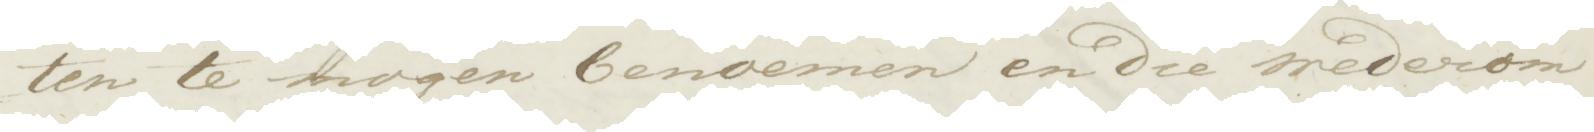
„ten te mogen benoemen en die wederom
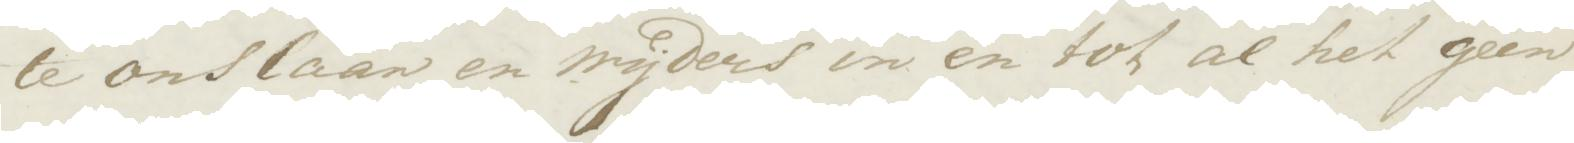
te onslaan en wijders in en tot al het geen
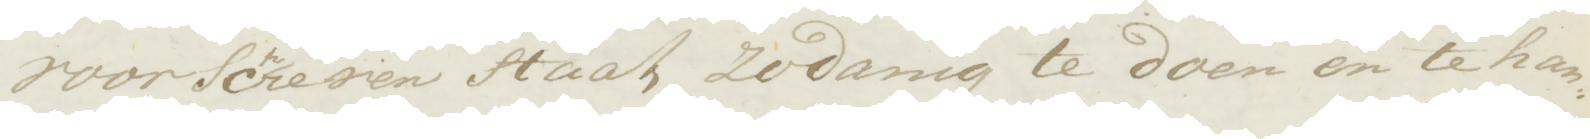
voorschreven staat zodanig te doen en te han„
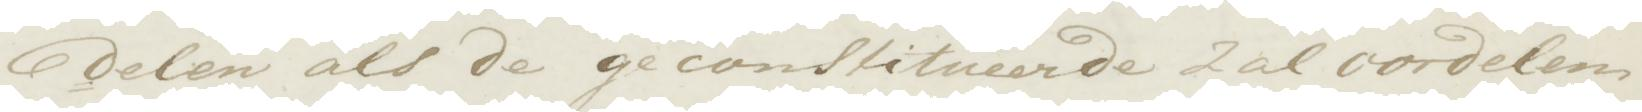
„delen als de geconstitueerde zal oordelen,
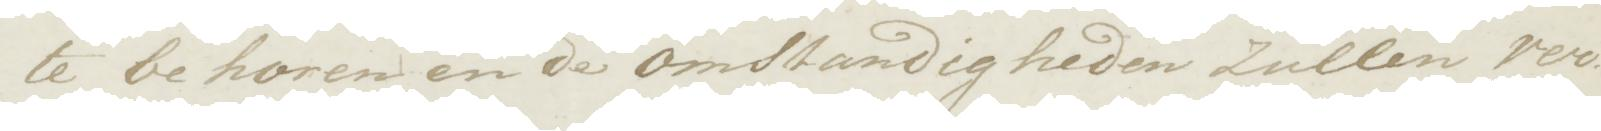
te behoren en de omstandigheden zullen ver„
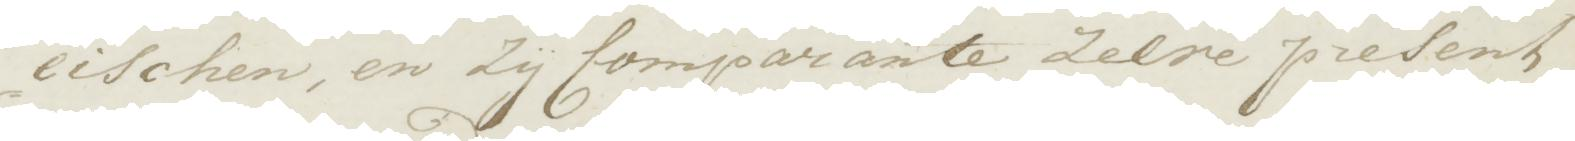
„eischen, en zij Comparante zelve present
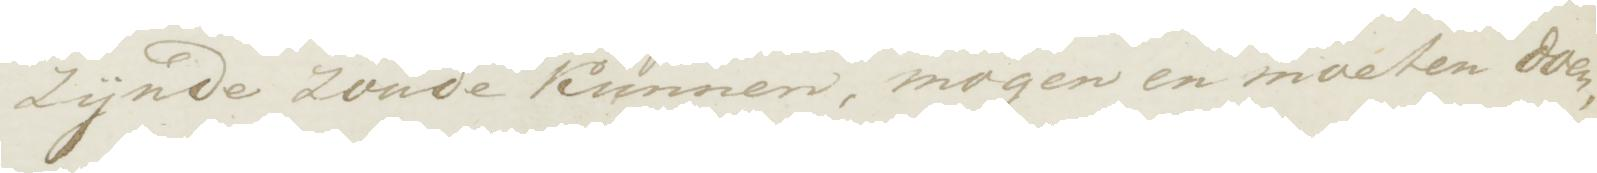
zijnde zoude kunnen, mogen en moeten doen,
